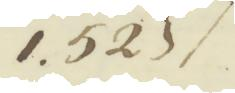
1.52
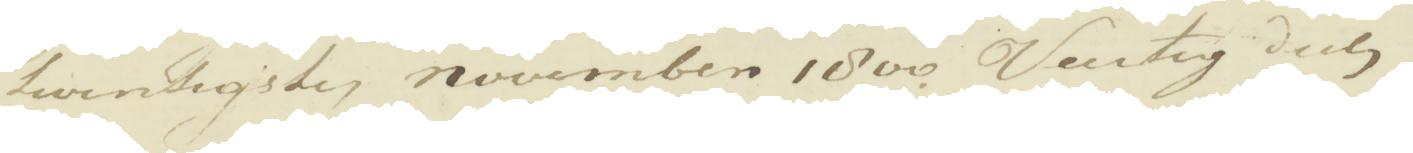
twintigsten november 1800 Veertig deel
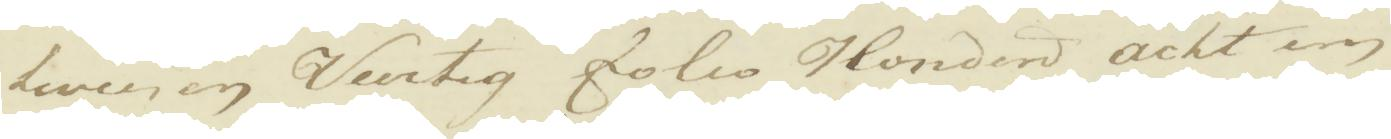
twee en Veertig folio Honderd acht en
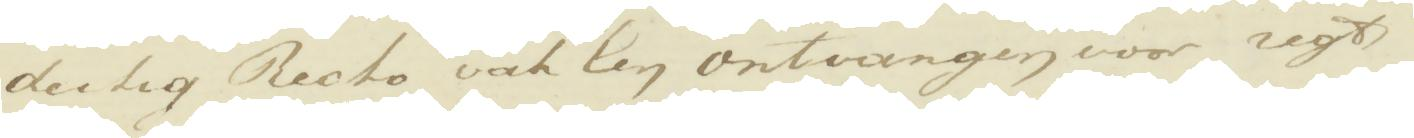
dertig Recto vak Een ontvangen voor regt
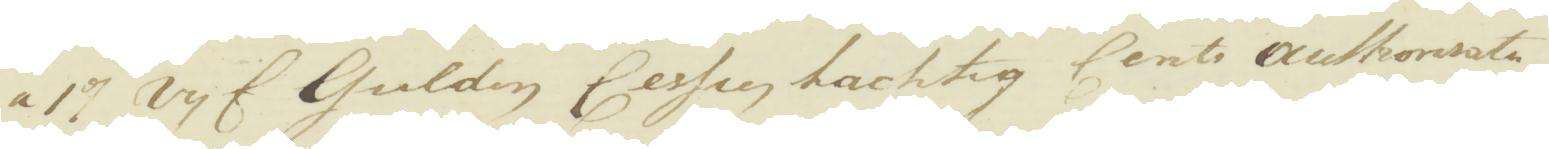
a 1% vyf Gulden Cessen tachtig Cents authorisatie
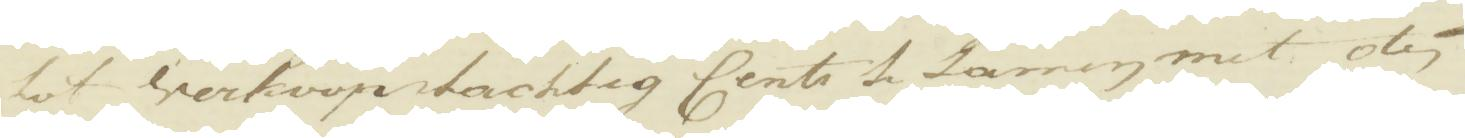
tot verkoop tachtig Cents te zamen met den
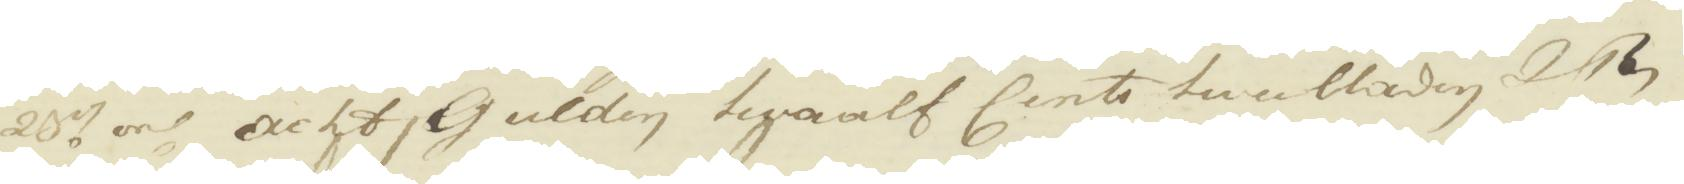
20% opc acht Gulden twaalf Cents twee bladen ZR
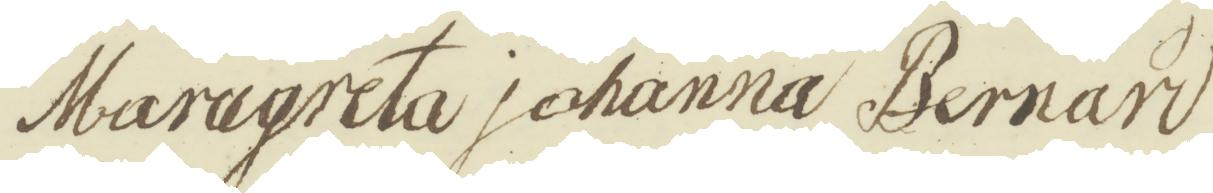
Maragreta Johanna Bernard
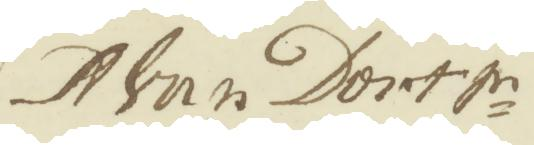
A van Dort I=r
